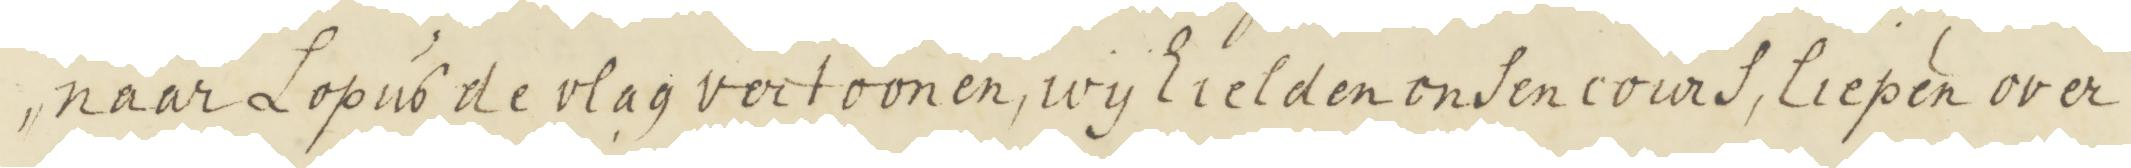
„naar Lopus de vlag vertoonen, wij hielden onsen cours, liepen over
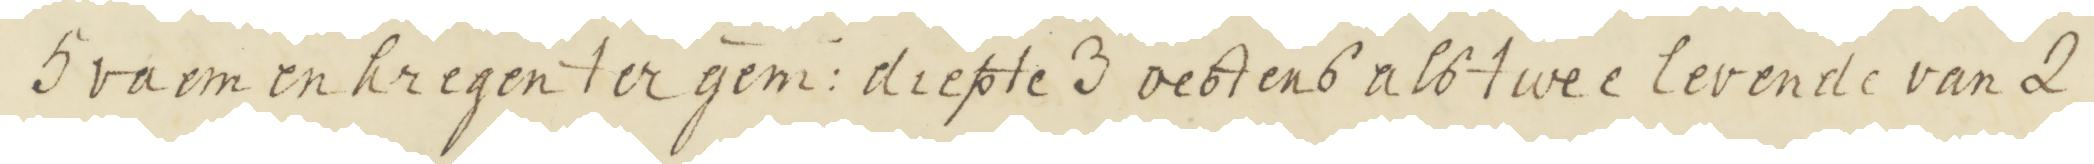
5 vaem en kregen ter gem: diepte 3 oesters als twee levende van 2
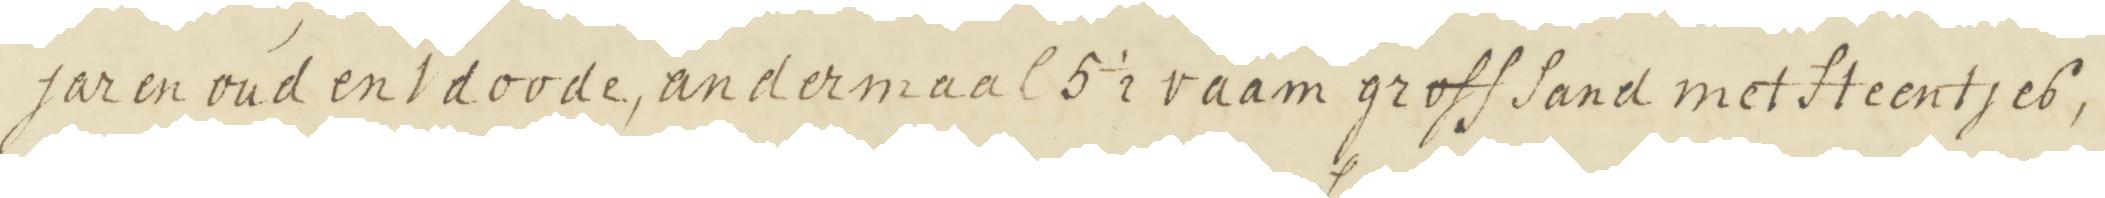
jaren oud en 1 doode, andermaal 5½ vaam groff sand met steentjes,
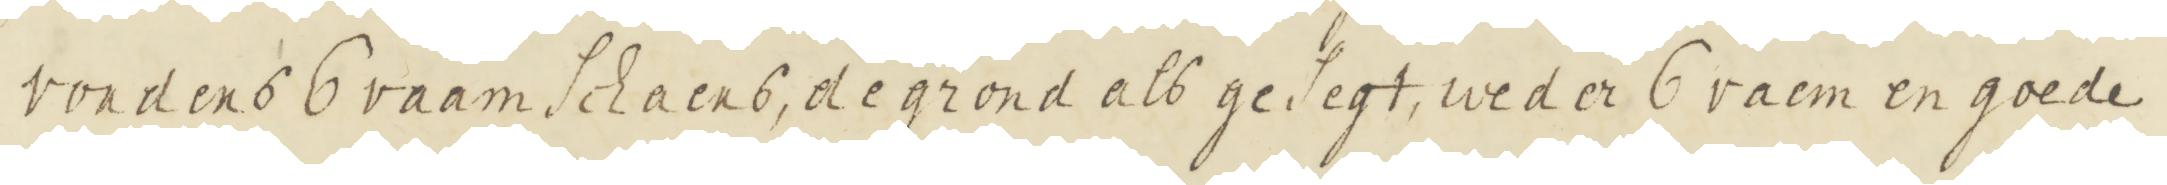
vorders 6 vaam schaers, de grond als gesegt, weder 6 vaem en goede
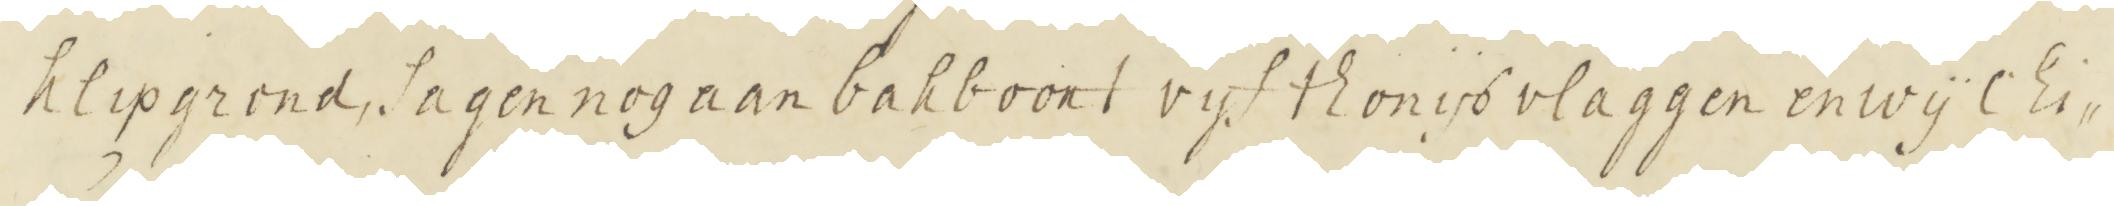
klipgrond, sagen nog aan bakboort vyf thonijs vlaggen en wij Chi„
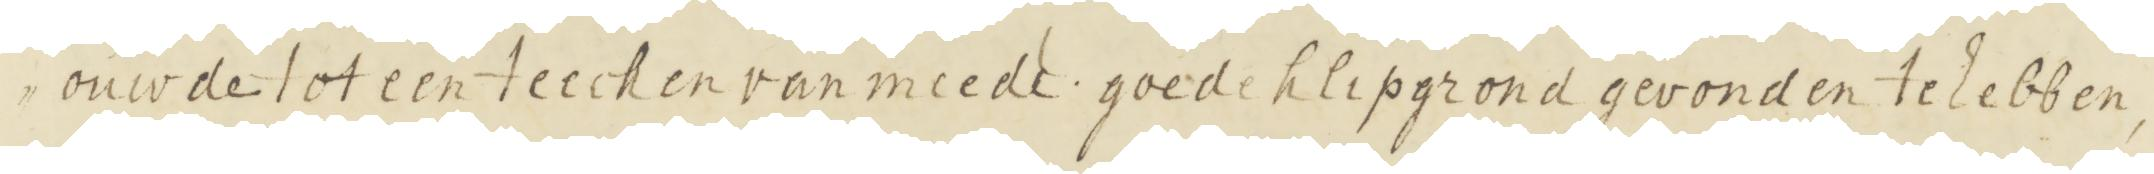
„ouwde tot een teecken van meede goede klipgrond gevonden te hebben,
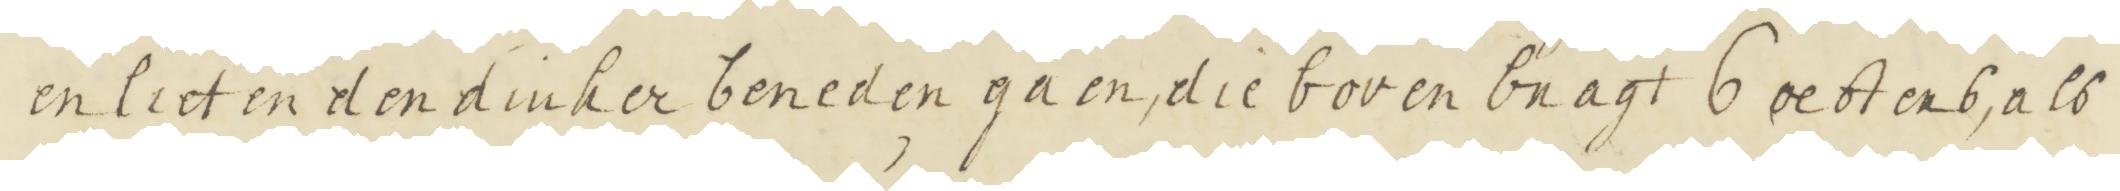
en liet en den duiker beneden gaen, die boven bragt 6 oesters, als
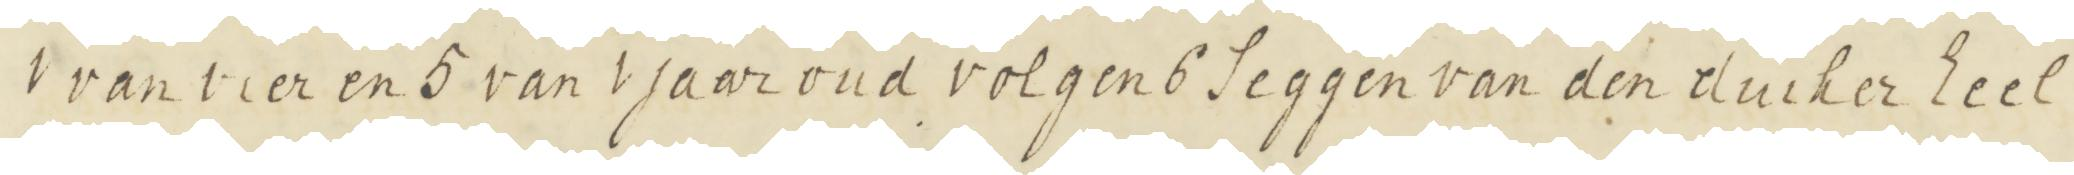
1 van vier en 5 van 1 jaar oud volgens seggen van den duiker heel
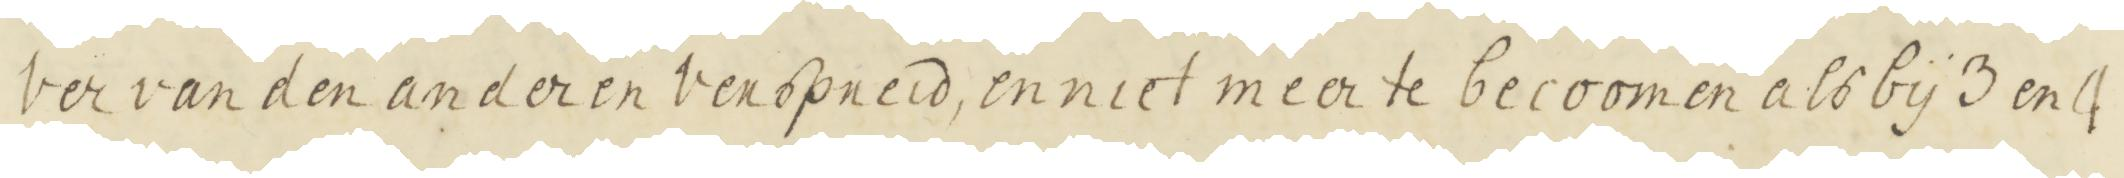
ver vanden anderen verspreid, en niet meer te becoomen als bij 3 en 4
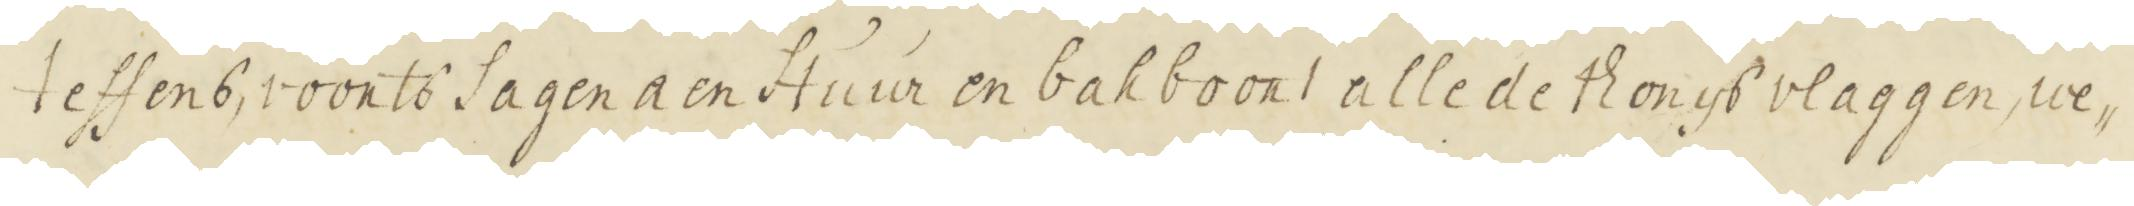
teffens, voorts sagen aen stuur en bakboort alle de thonijs vlaggen, we„
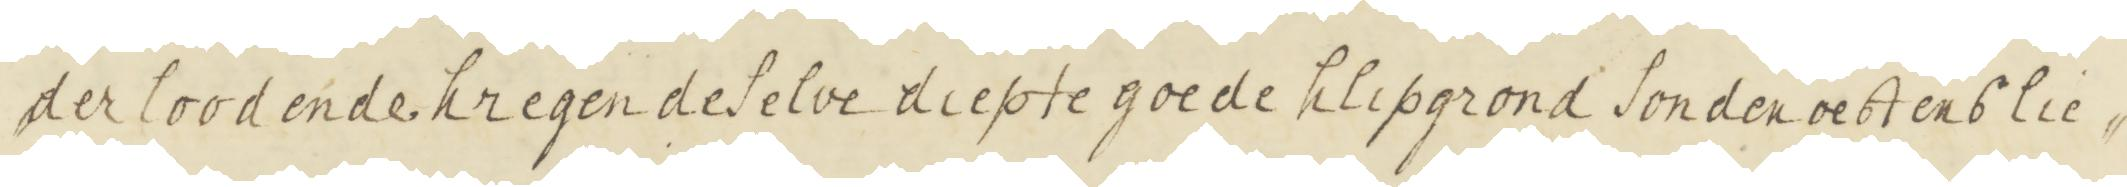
der loodende kregen deselve diepte goede klipgrond sonder oesters lie„
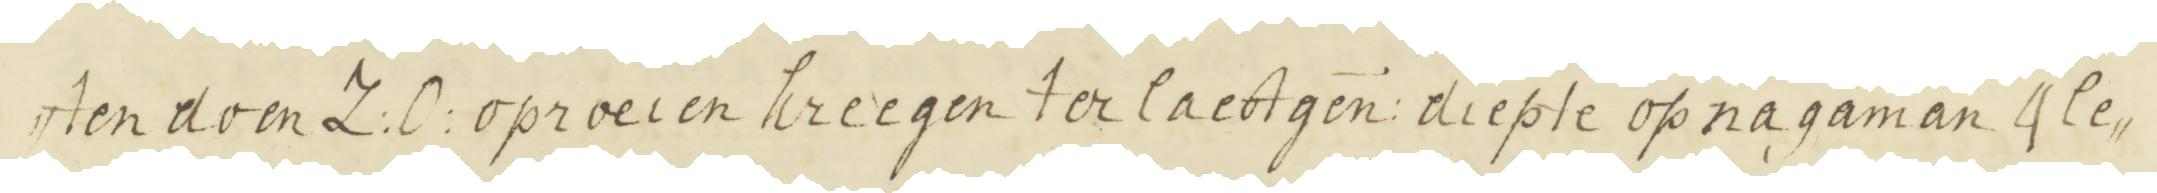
„ten doen Z: O: oproeien kreegen ter laestgen: diepte op nagaman 4 le„
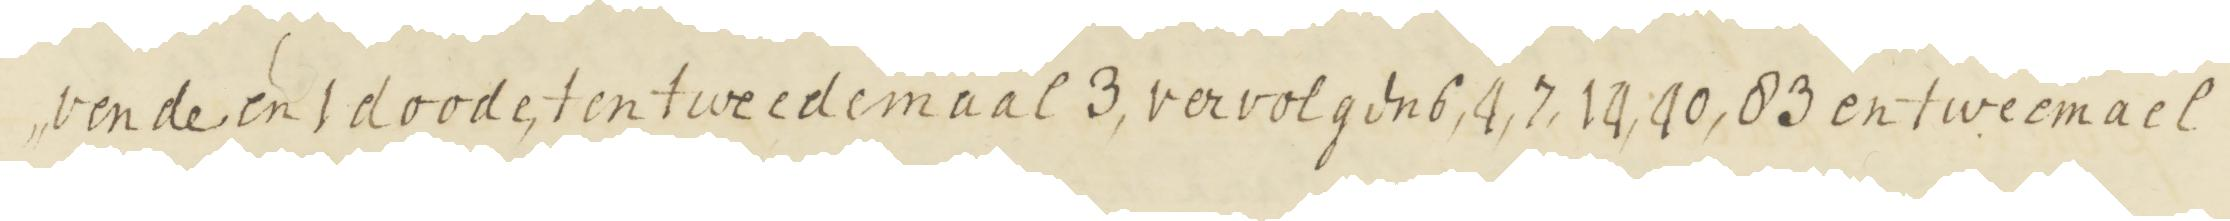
„vende en 1 doode, ten tweedemaal 3, vervolgens, 4, 7, 14, 40, 83 en tweemael
